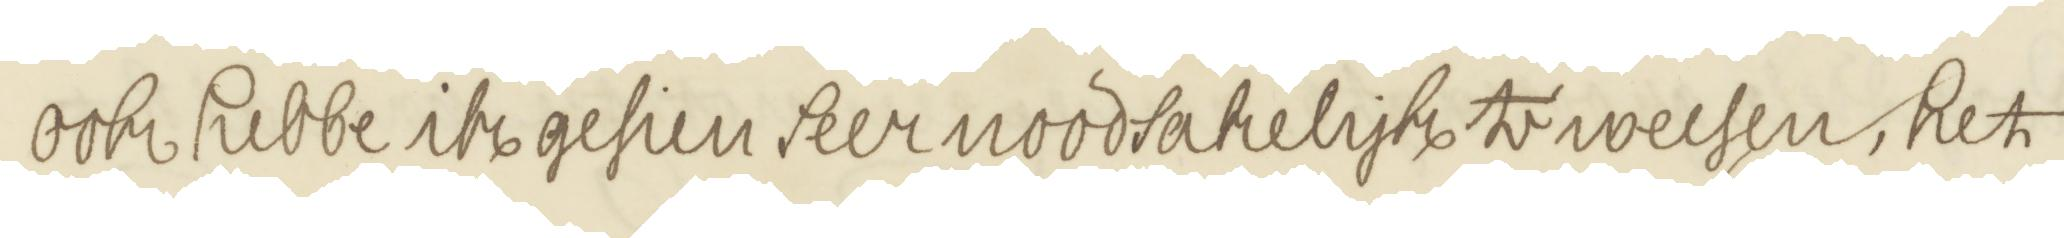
ook hebbe ik gesien seer noodsakelijk te weesen, het
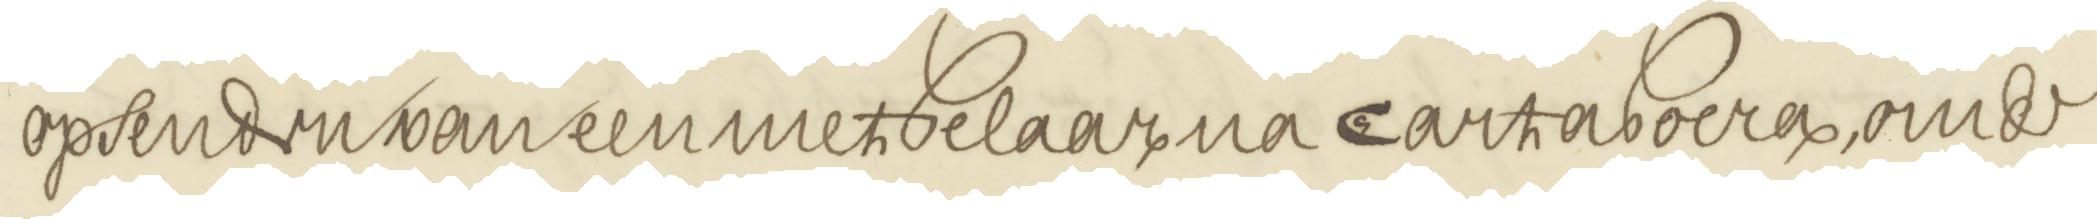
opsenden van een metselaar na cartasoera, om de
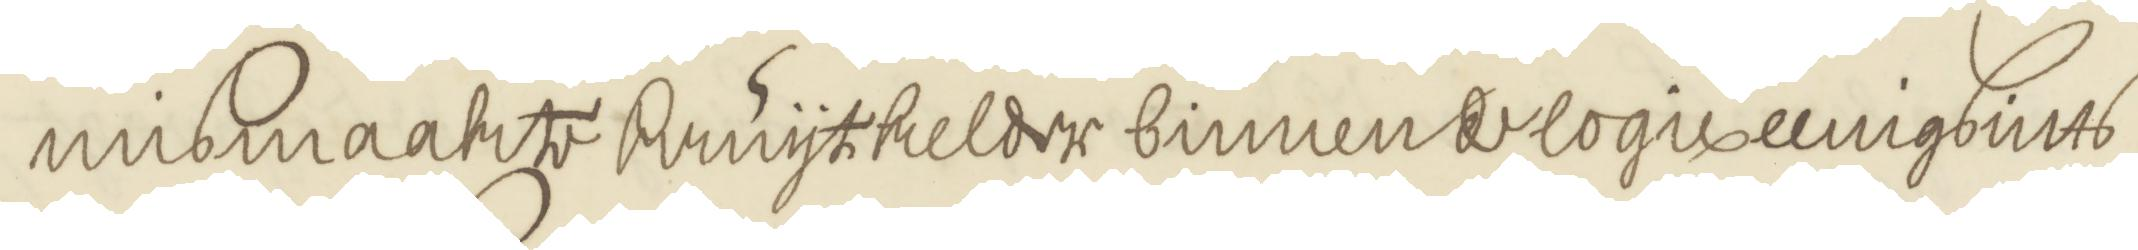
mismaakte kruijtkelder binnen de logie eenigsints
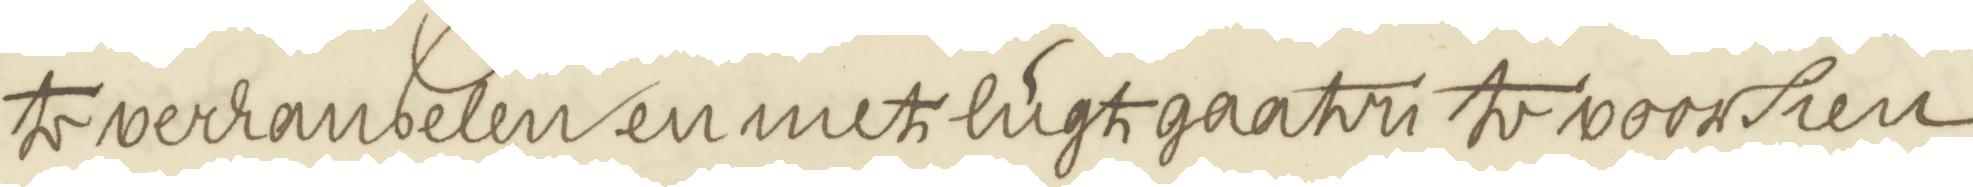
te verhanselen en met lugt gaaten te voorsien,
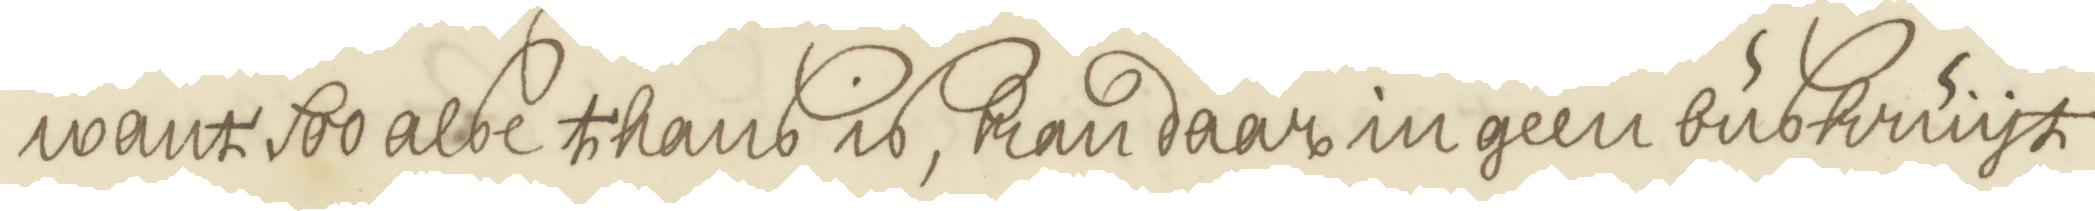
want soo alse thans is, kan daar in geen buskruijt
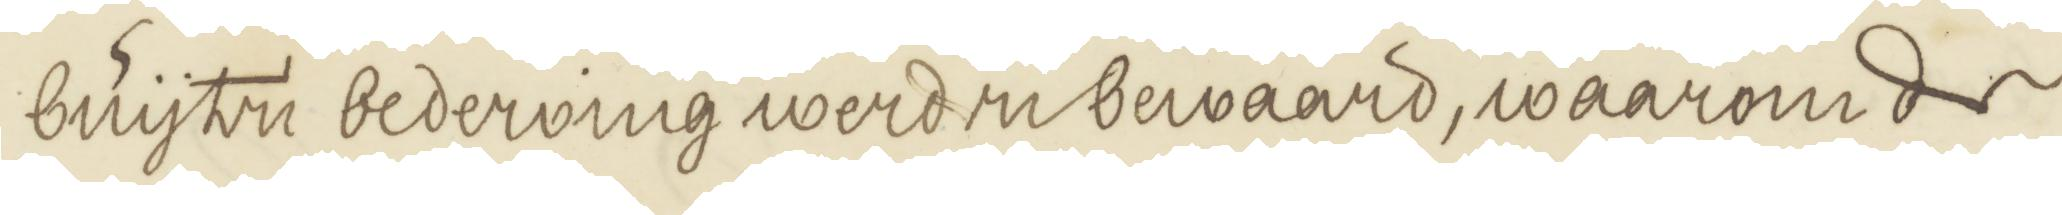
buijten bederving werden bewaard, waarom de
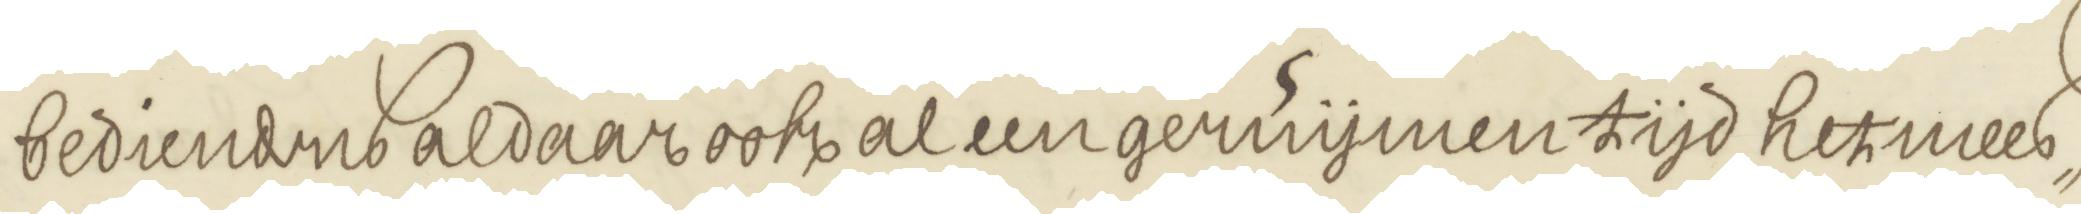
bediendens aldaar ook al een geruijmen tijd het mees„
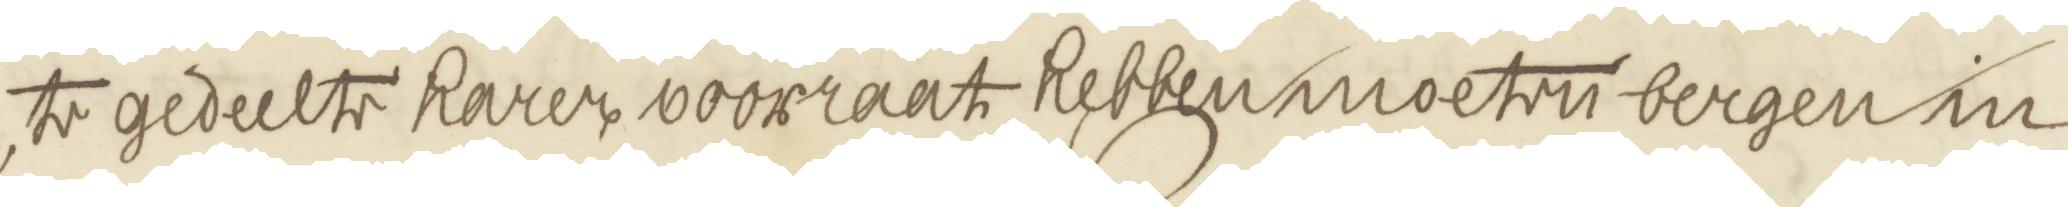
te gedeelte harer voorraat hebben moeten bergen in
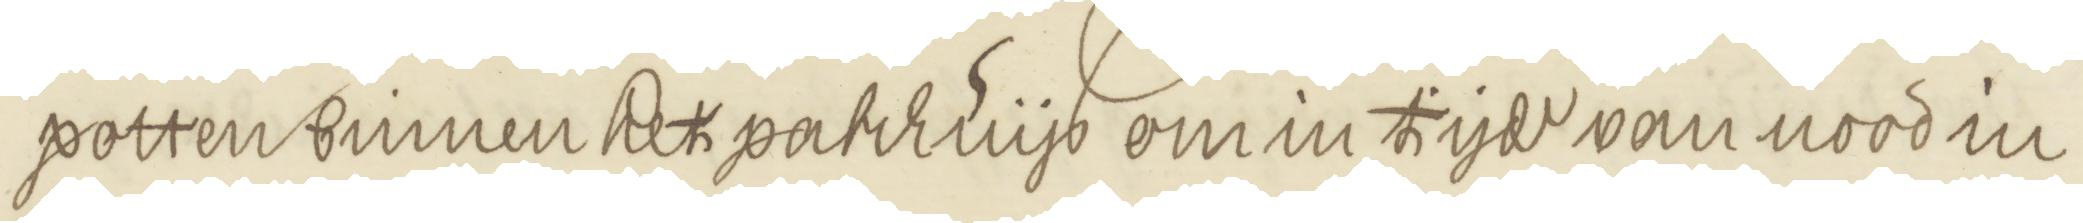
potten binnen het pakhuijs om in tijde van nood in
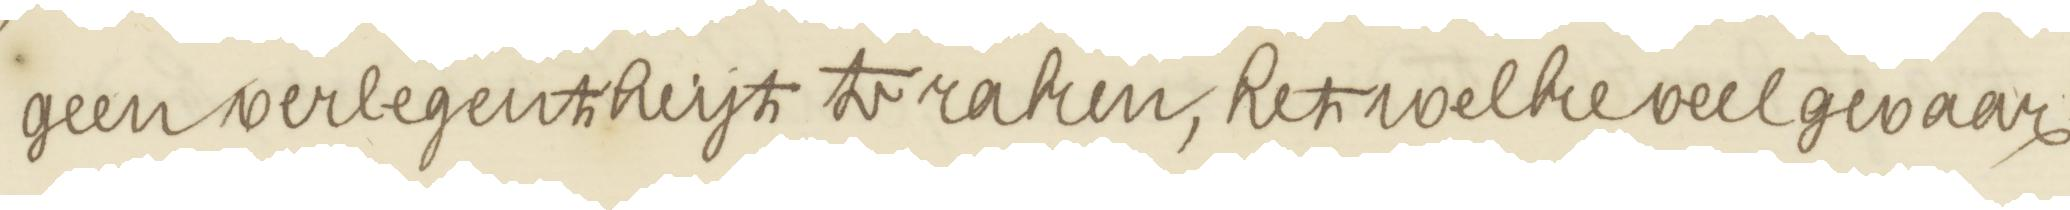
geen verlegentheijt te raken, het welke veel gevaar
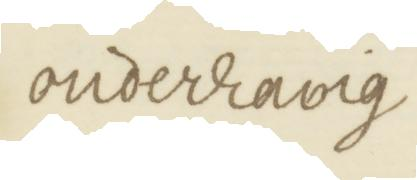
onderhavig
